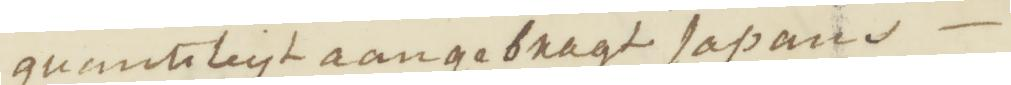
quantiteijt aan gebragt Japans —
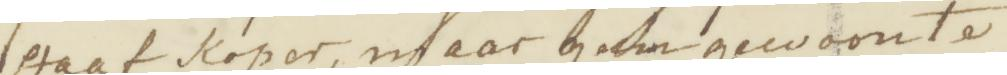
staaf koper, maar geen gewoonte
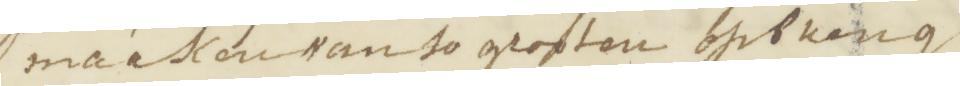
maaken van so grooten opbreng
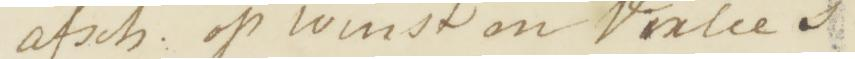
afsch. op winst en Verlies
